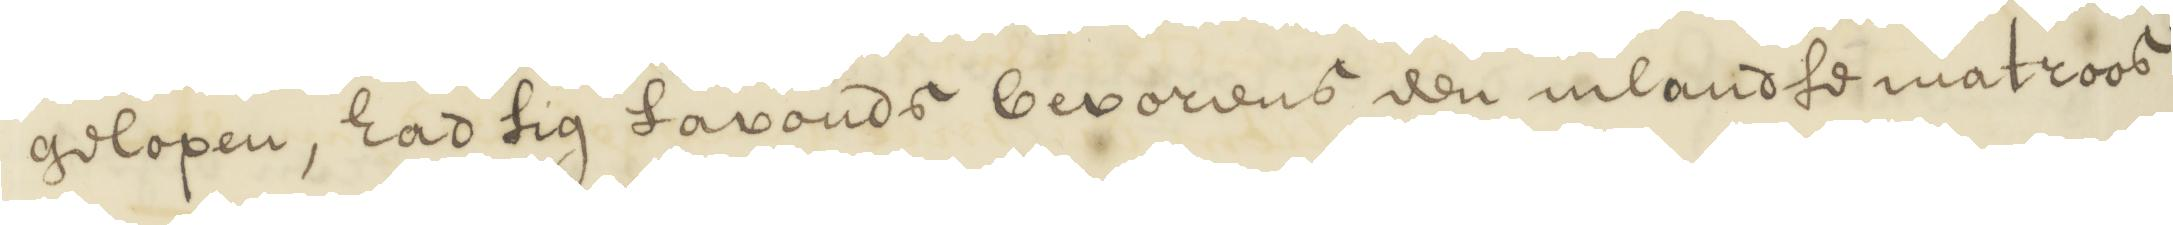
gelopen, had sig 'savonds bevorens een inlandse matroos
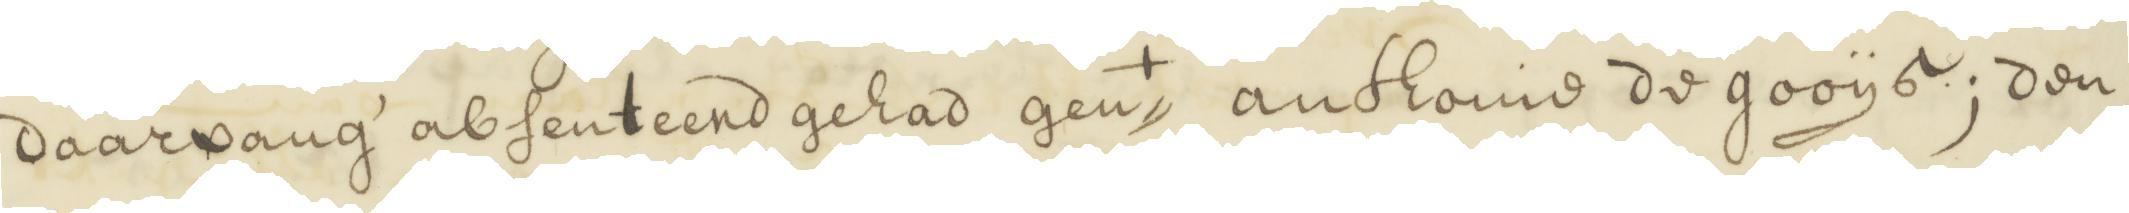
daarvang’ absenteerd gehad gen„t anthonie de gooijs; den
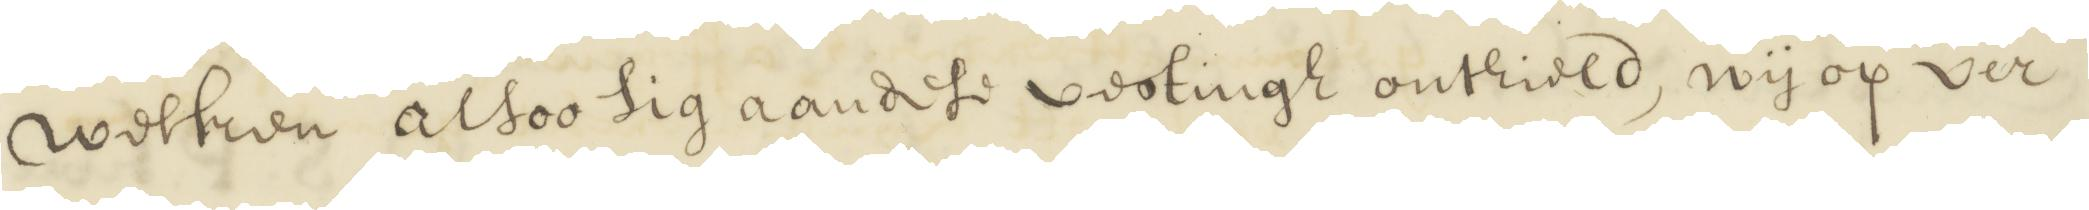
welken alsoo sig aan dese vestingh onthield, wij op ver
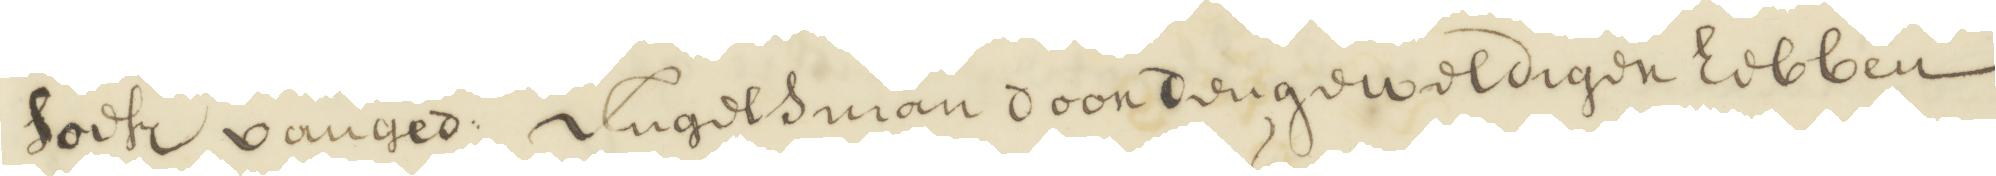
soek van ged:te Engelsman door den geweldiger hebben
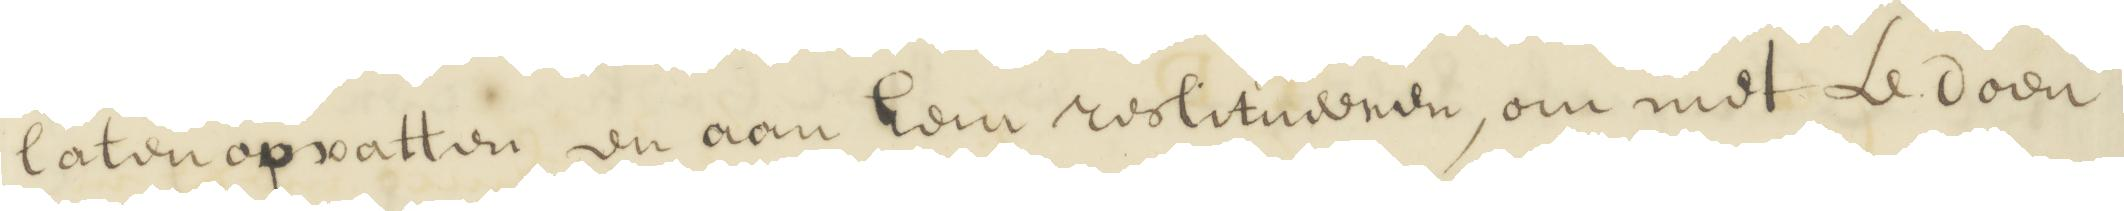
laten opvatten en aan hem restitueeren, om niet te doen
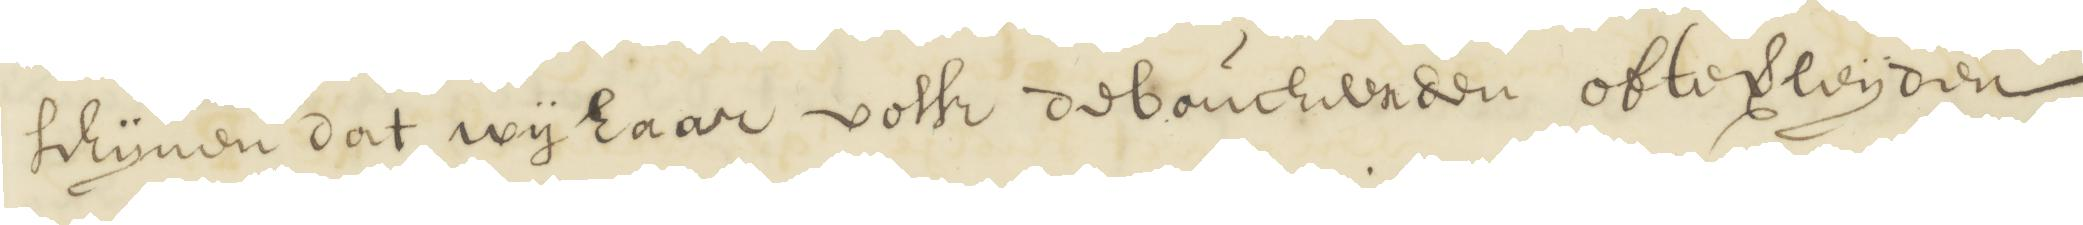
schijnen dat wij haar volk deboucheerden ofte verleijden
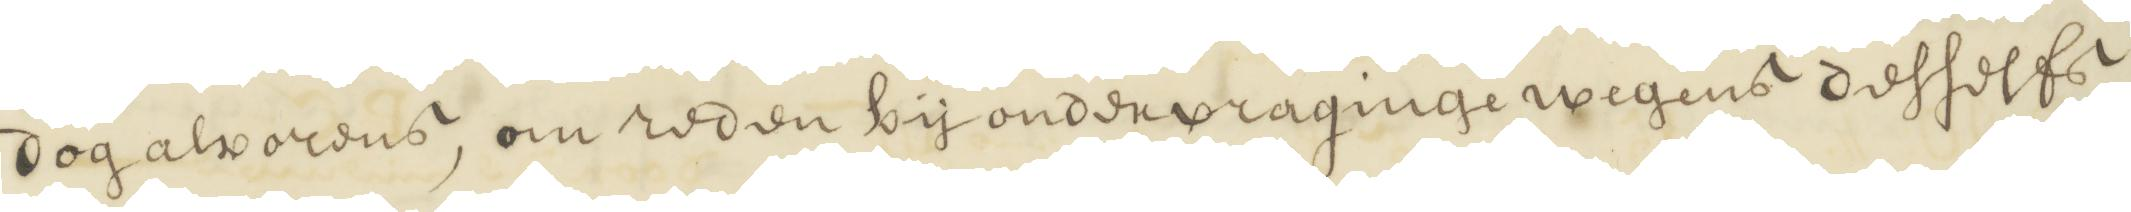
dog alvorens, om reden bij ondervraginge wegens desselfs
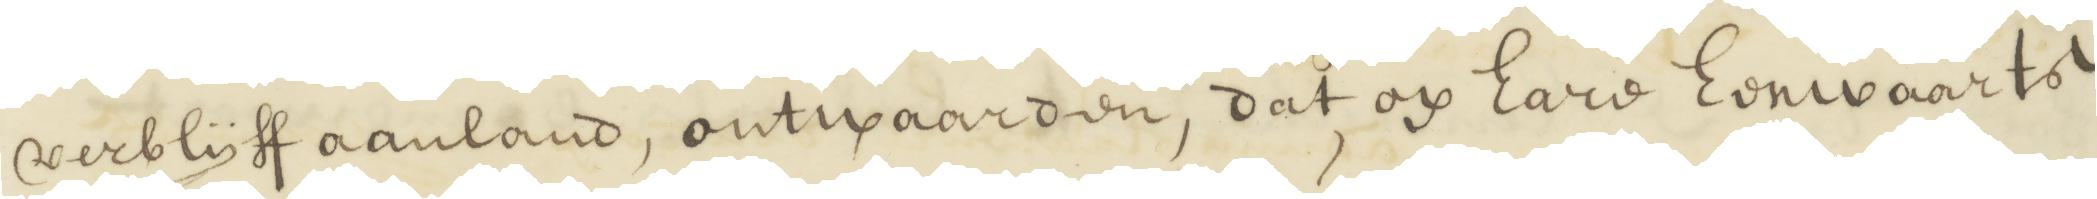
verblijff aanland, ontwaarden, dat op hare herwaarts
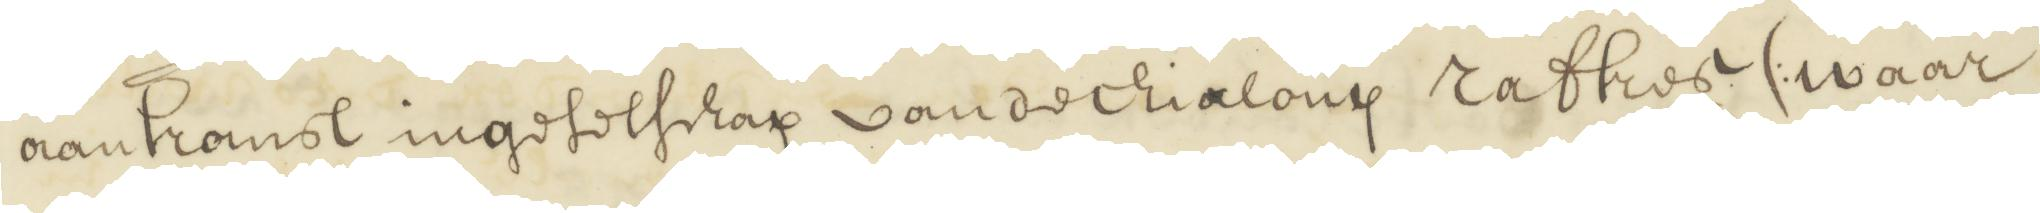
aankomst ingeselschap van de chialoup rafkes (:waar
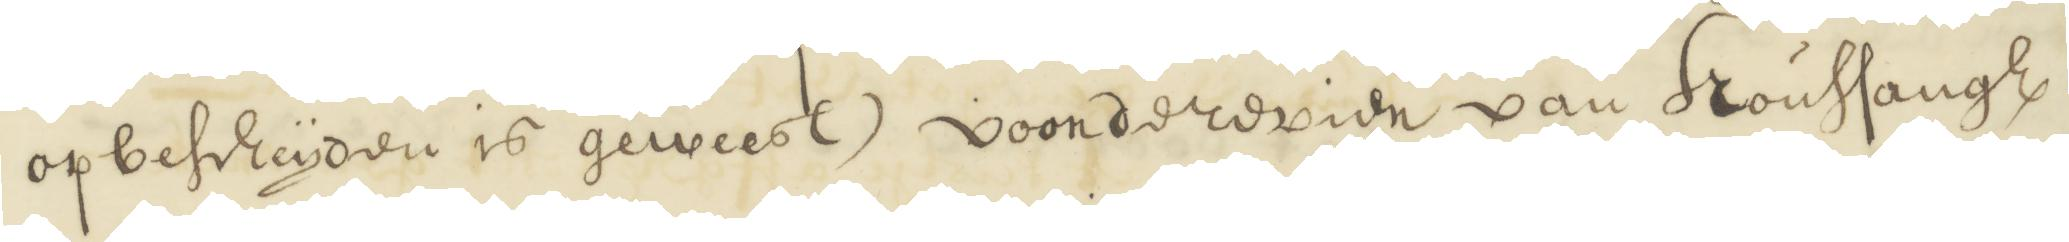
op bescheijden is geweest) voor derevier van troussangh
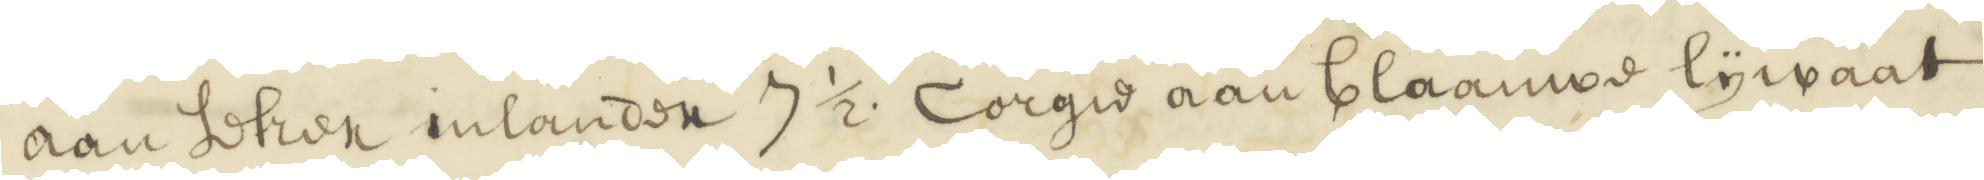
aan seker inlander 7½. Corgie aan blaauwe lijwaat
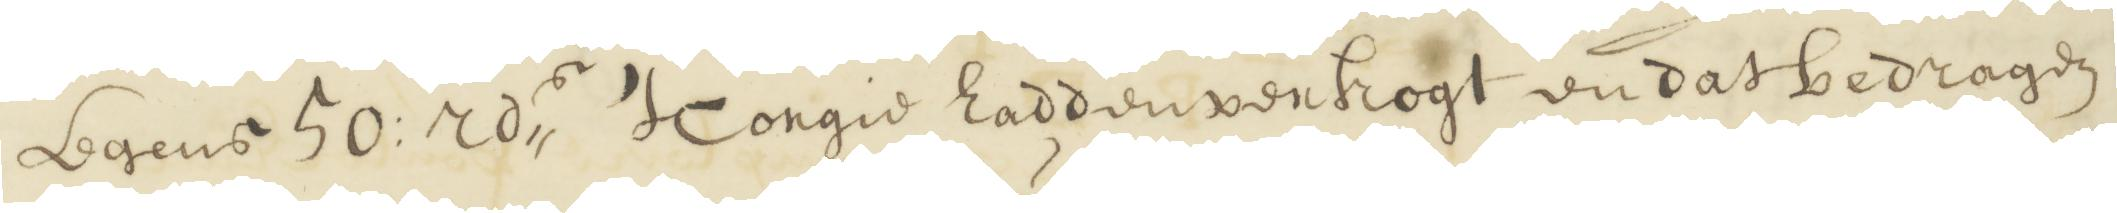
tegens 50: rd„s ’tCorgie hadden verkogt en dat bedragen
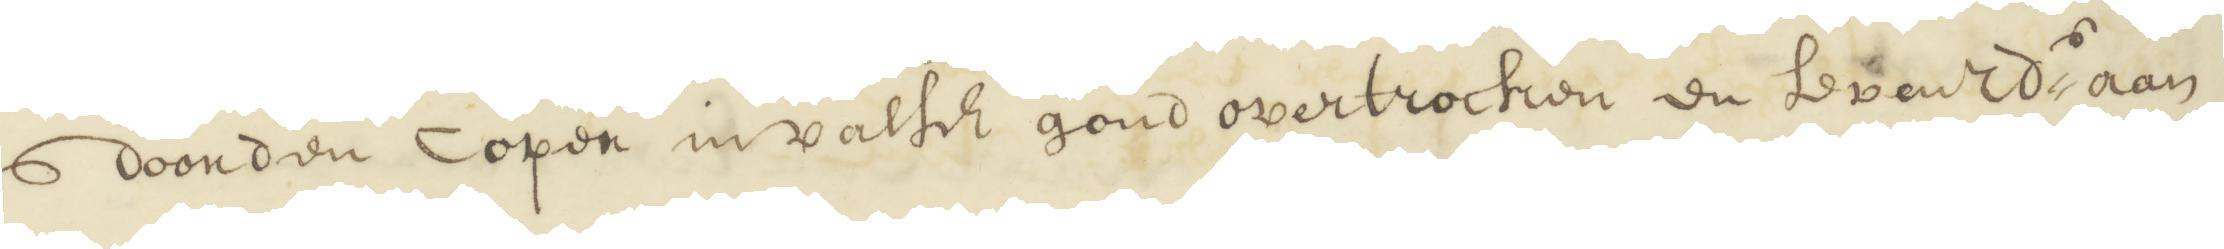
door den Coper in valsch goud overtrocken en seven rd„s aan
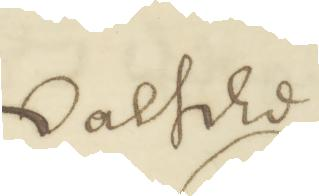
valsche
